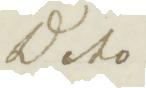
Dito . . . . . . .
